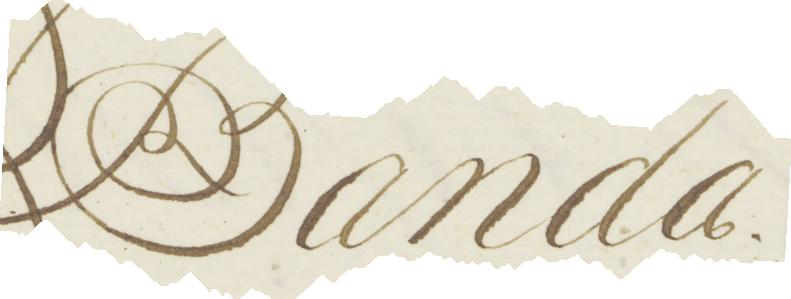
Banda.
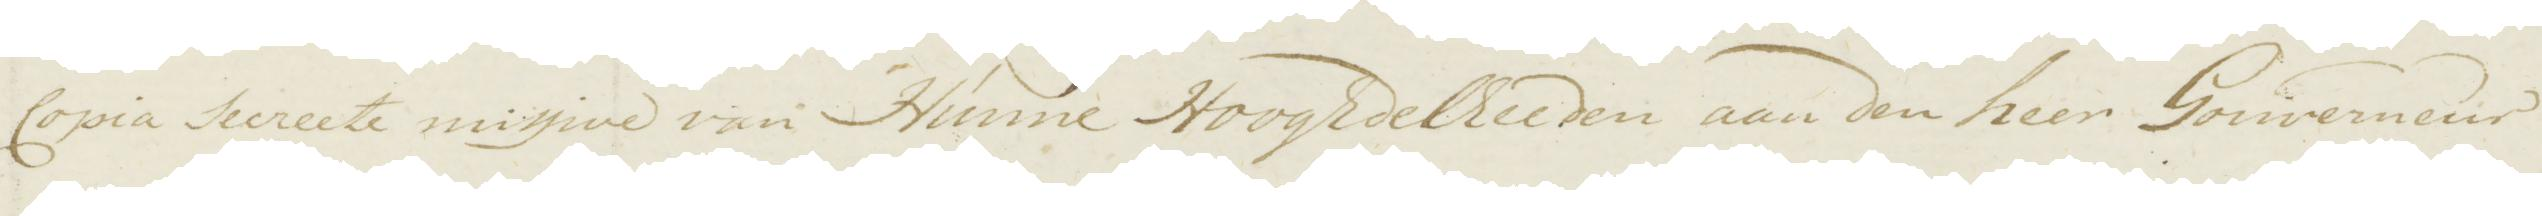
Copia secreete missive van Hunne HoogEdelheeden aan den heer Gouverneur
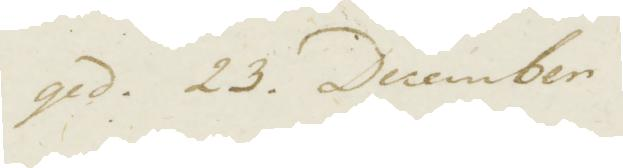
ged: 23. December
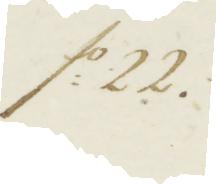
p: 22.
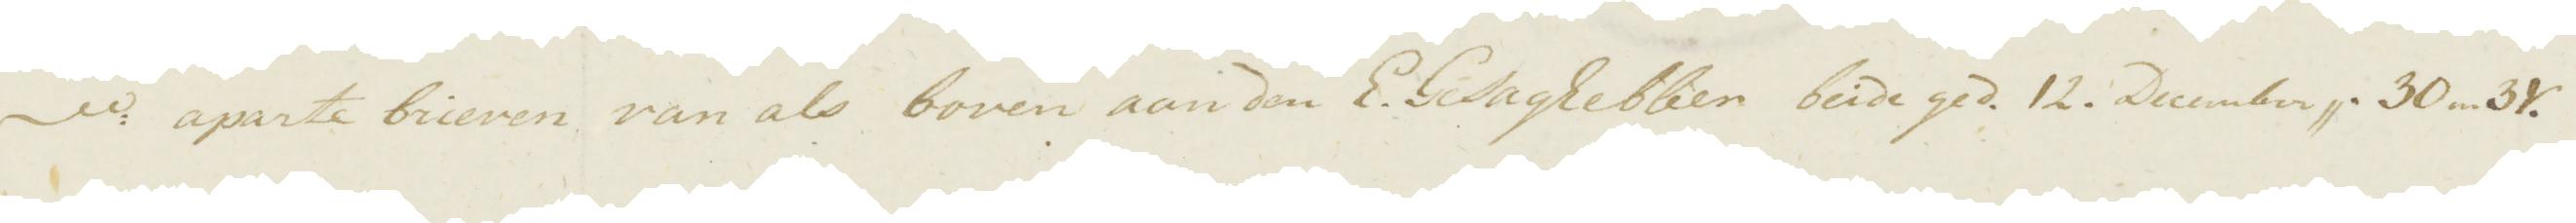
D=o aparte brieven van als boven aan den E. Gesaghebber beide ged. 12. December„. 30 en 31.
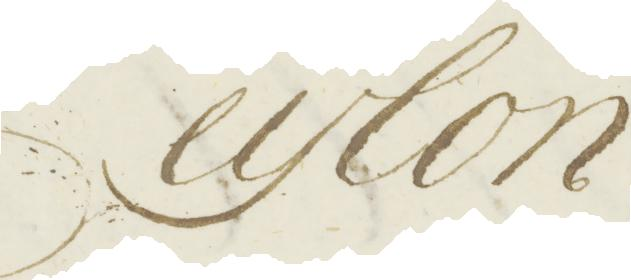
eylon
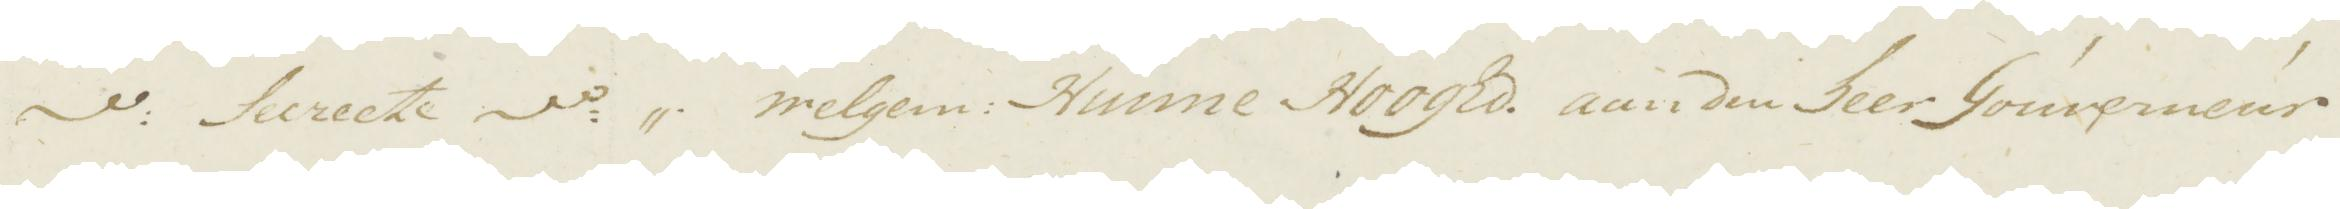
D=o Secreete D=o „. welgem: Hunne Hooghd. aan den heer Gouverneur
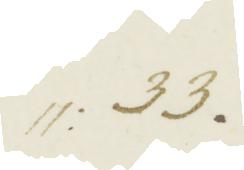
„: 33.
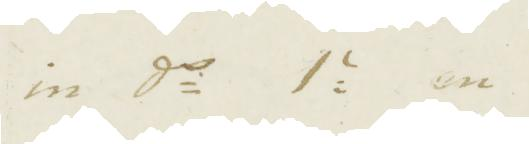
in d=o 1=e en
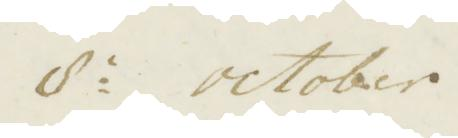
8=e october
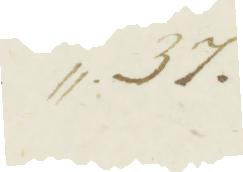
„: 37.
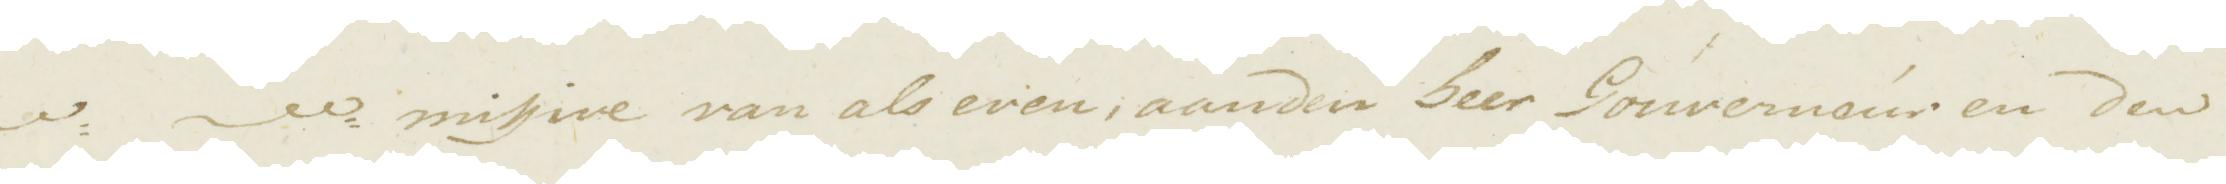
D=o D=o missive van als even, aan den heer Gouverneur en den
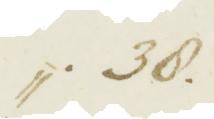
„. 38.
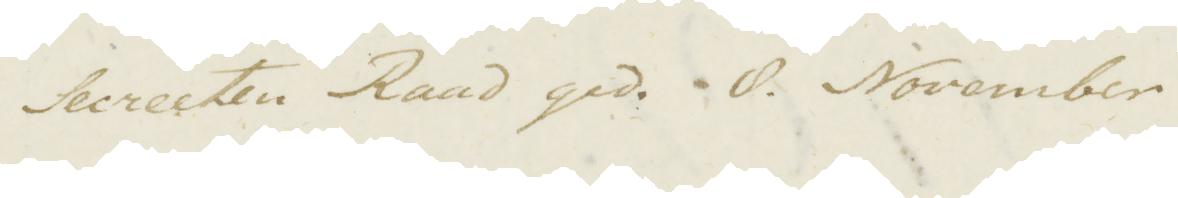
secreeten Raad ged. 8. November
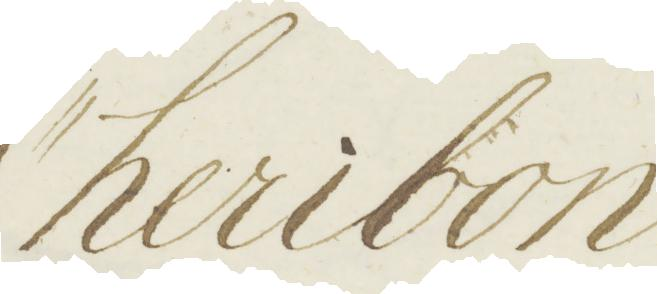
heribon
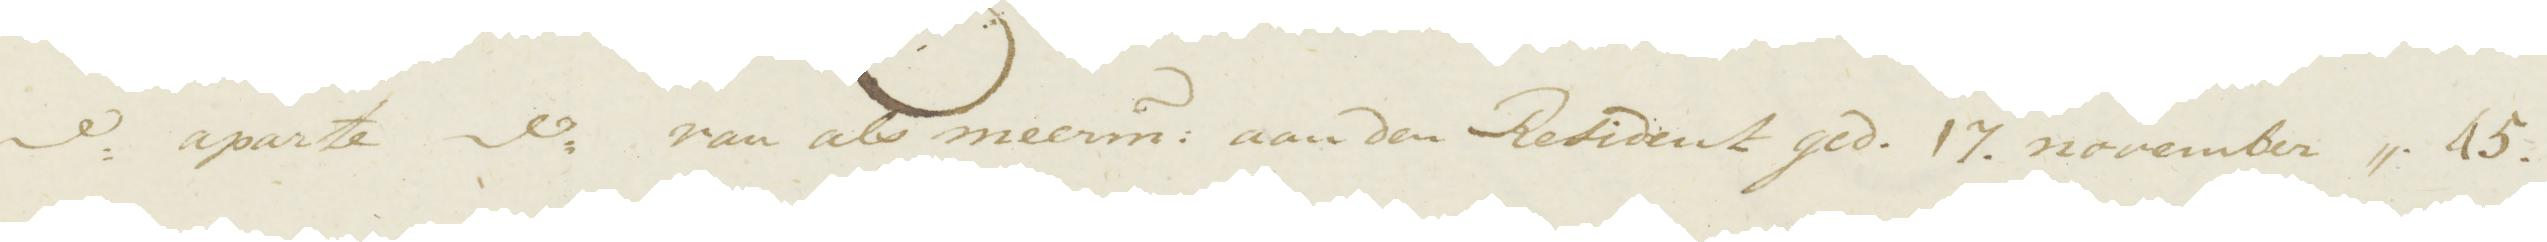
D=o aparte D=o van als meerm: aan den Resident ged. 17. november „. 45.
